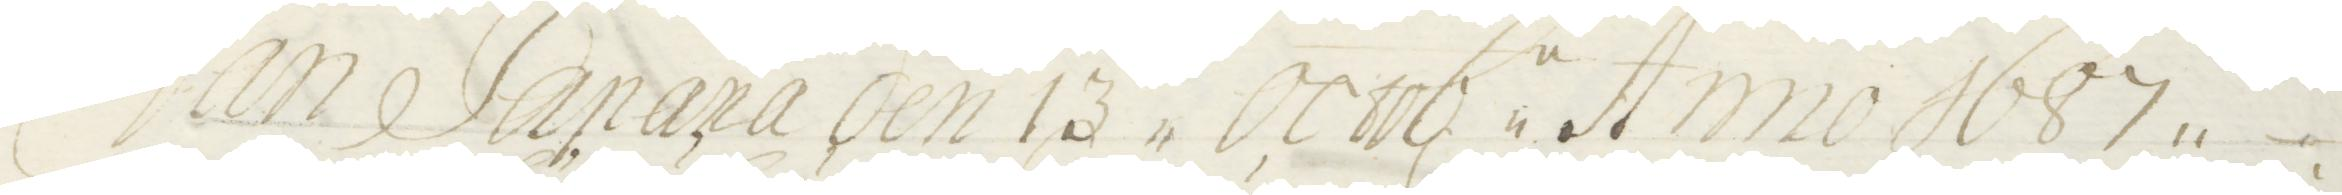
Van Japara den 13„en Octob„r Anno 1687„
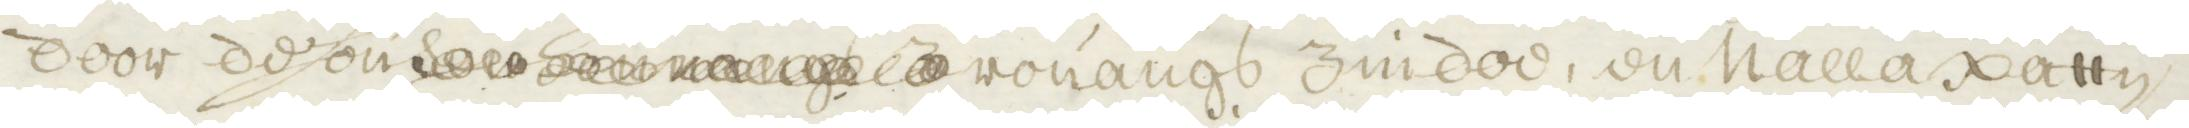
door de sou sou hoen nangs ee rouangs zindoe, en nalla pattij
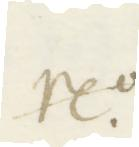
re.v
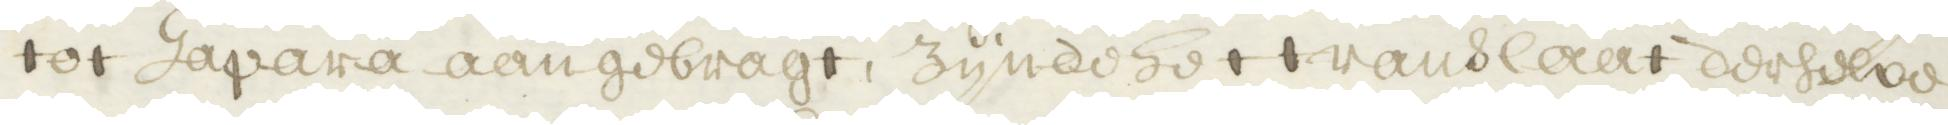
tot Japara aangebragt, zijn de het translaat derselve
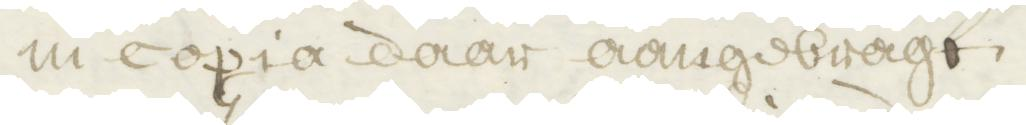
in copia daar aangebragt,
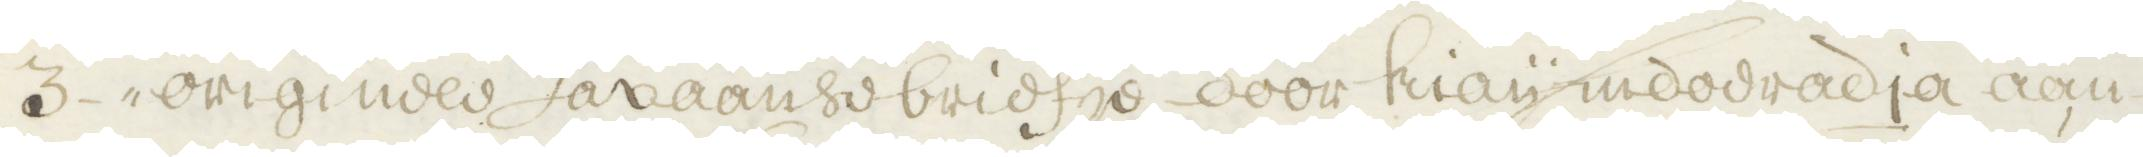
3 - „ originele Javaanse briefje door kiaij indoeradja aan
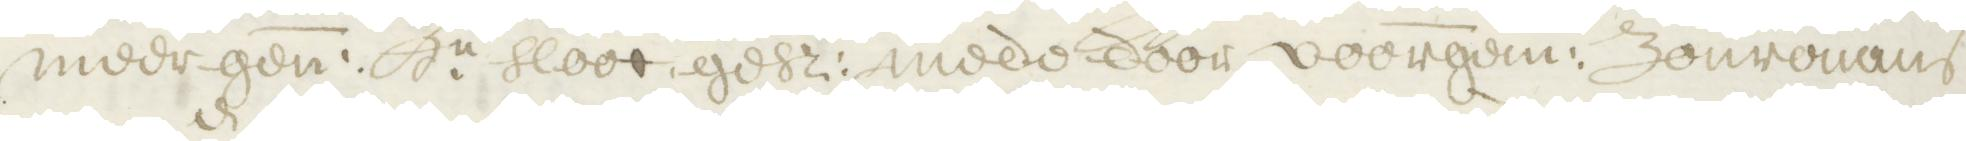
meer gen: H:r sloot, gesz: mede door voorgem: Zourouans
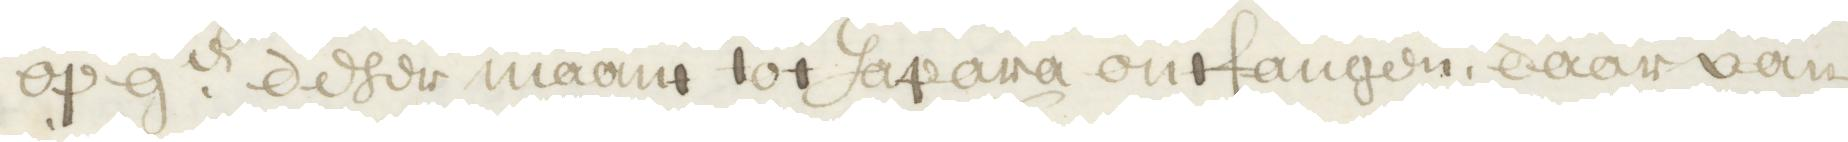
op 9:e deser maant tot Japara ontfangen, daar van
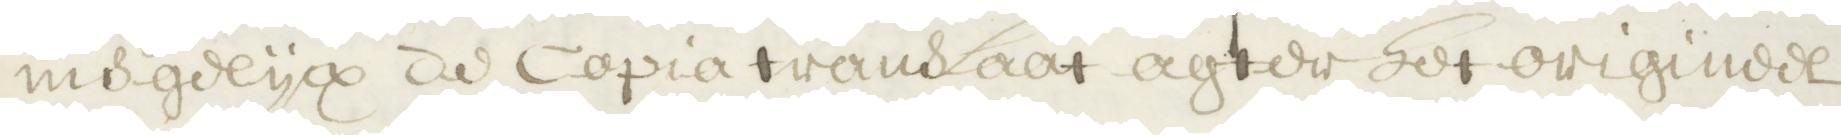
insgelijcx de Copia translaat agter het origineel
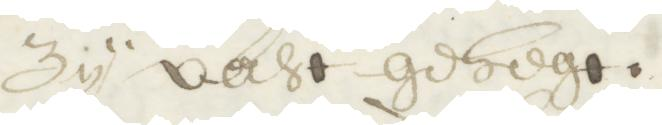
zij vast gehegt.
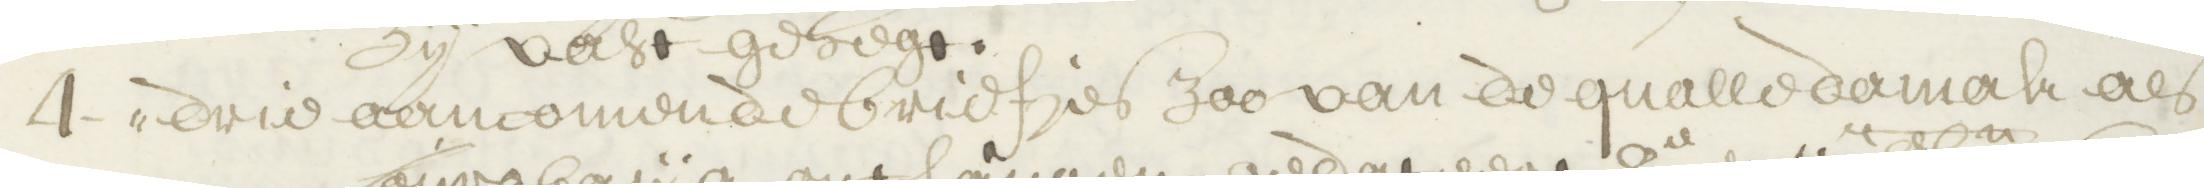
4. „ drie aancomende briefjes zoo van de qualledamak als
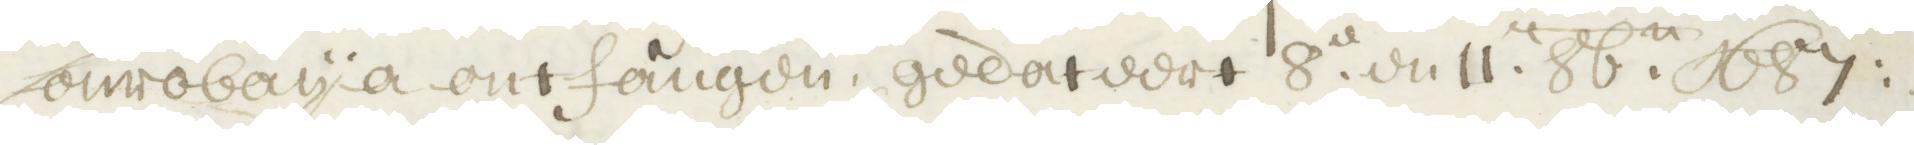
sourobaija ontfangen, gedateert 8.e en 11.e 8b.r 1687:
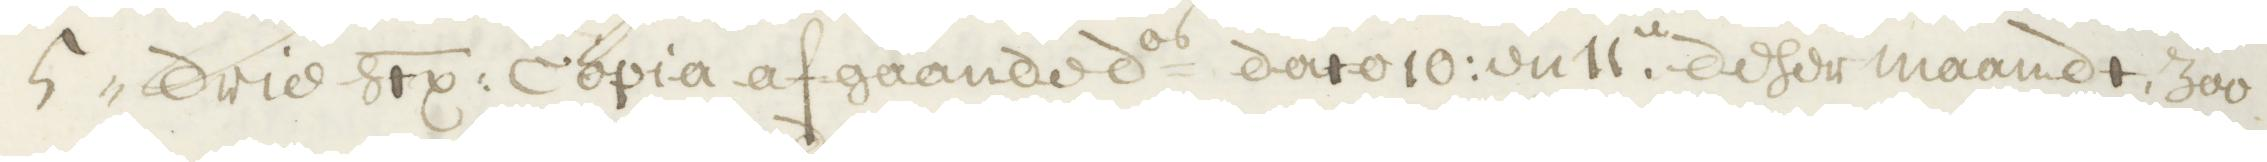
5 „ drie stx: Copia afgaande d=os dato 10: en 11.e deser maandt, zoo
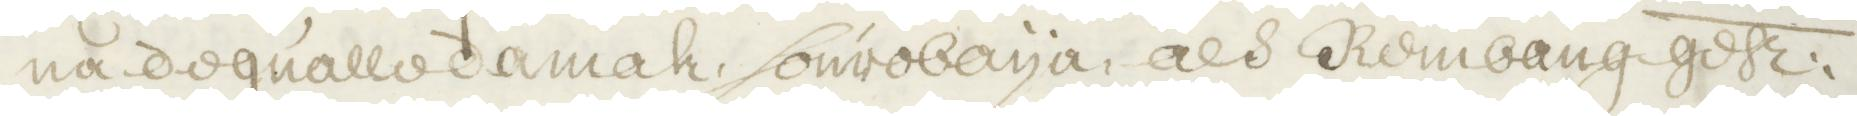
na dequalledamak, sourobaija, als Rembang gesz:
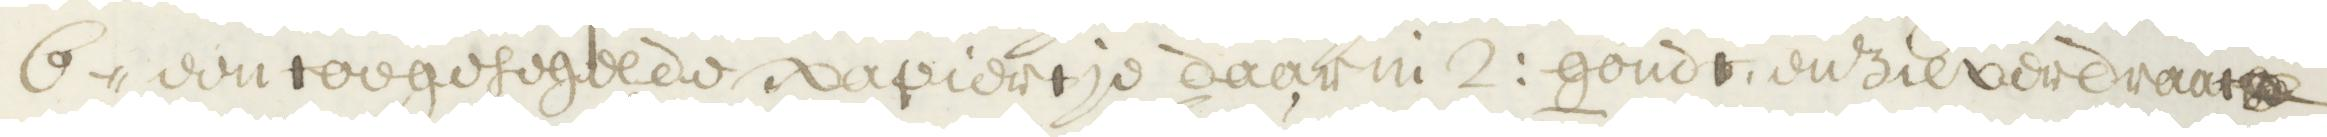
6 „ een toegesegelde papiertje daar in 2: goudt, en zilverdraats
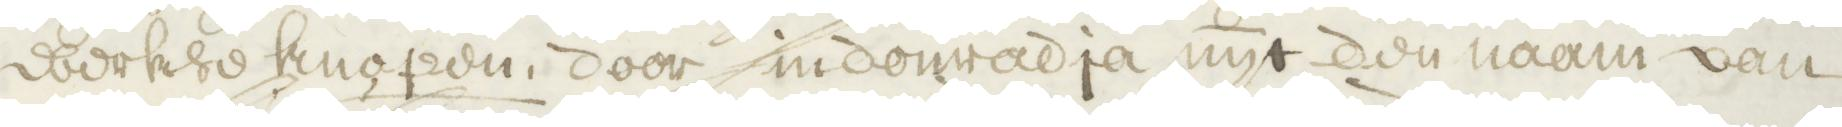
werkse knopen, door sindouradja uijt den naam van
